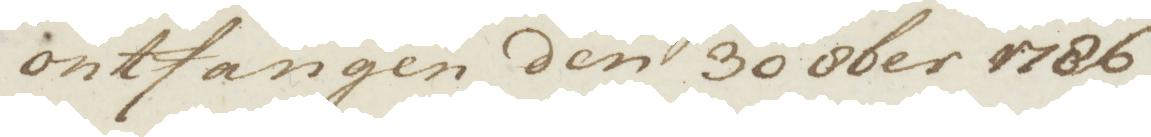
ontfangen den 30 8ber 1786
